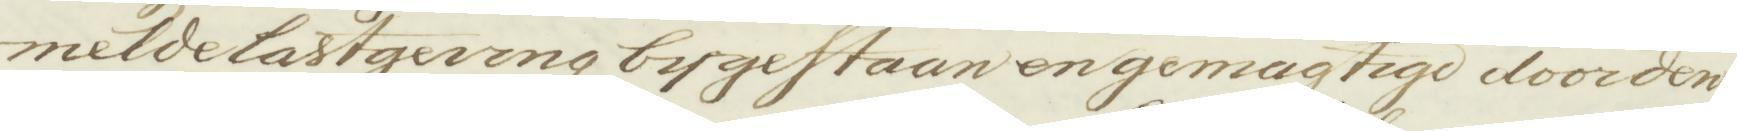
melde lastgeving bygestaan en gemagtigd door den
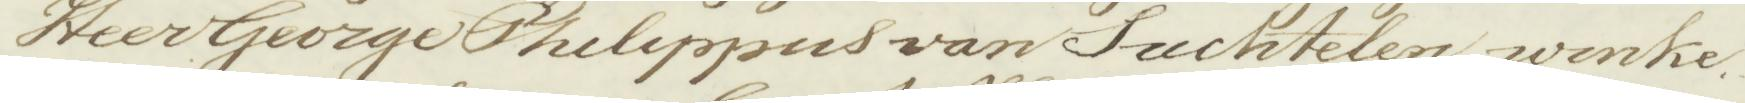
Heer George Philippus van Suchtelen, winke„
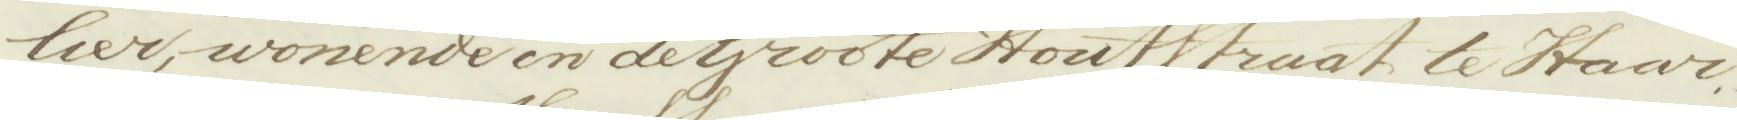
lier, wonende in de Groote Houtstraat te Haar,
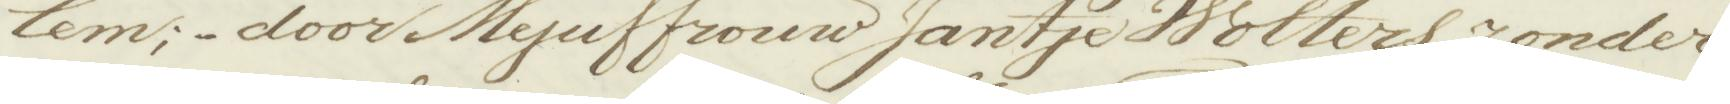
lem; - door Mejuffrouw Jantje Wolters, zonder
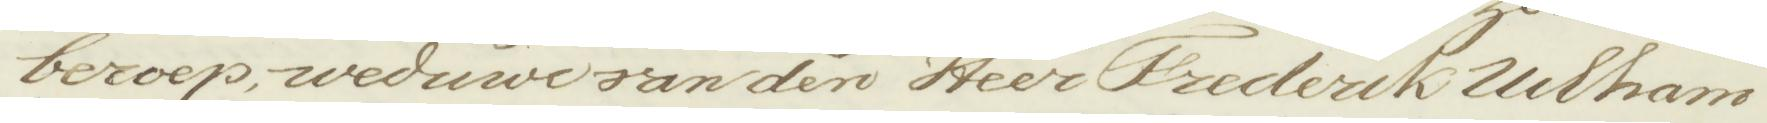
beroep, weduwe van den Heer Frederik Uilham
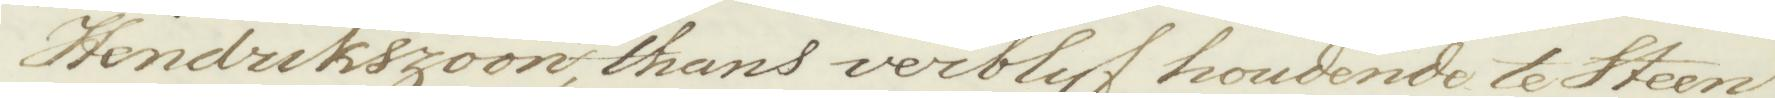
Hendrikszoon, thans verblyf houdende te steen
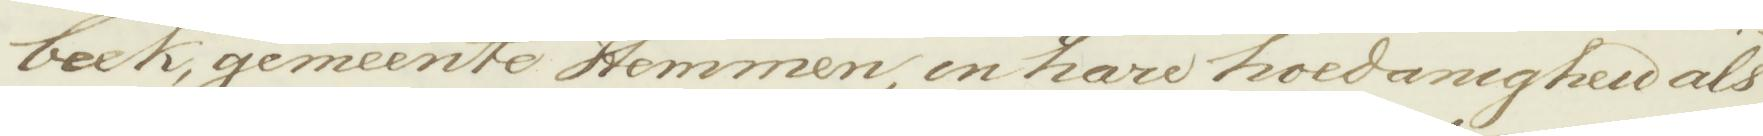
beek, gemeente Hemmen, in hare hoedanigheid als
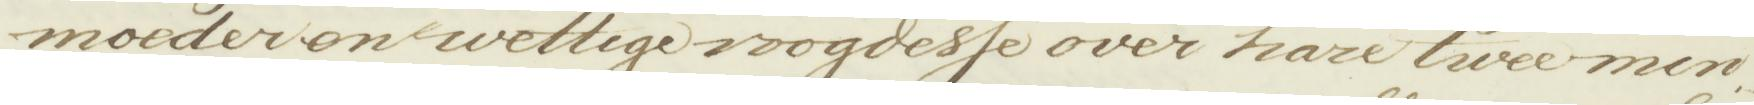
moeder en wettige voogdesse over hare twee min,
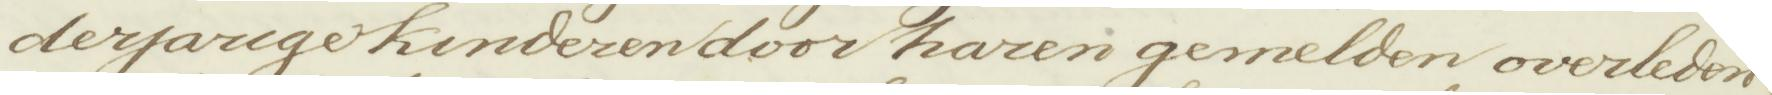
derjarige kinderen door haren gemelden overleden
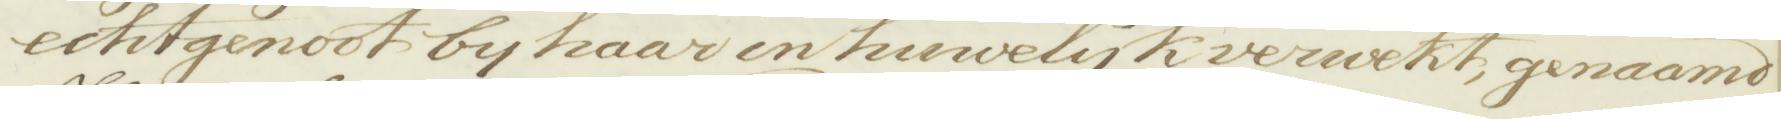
echtgenoot by haar in huwelyk verwekt, genaamd
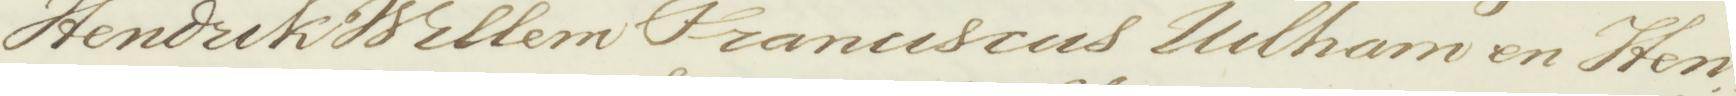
Hendrik Willem Franciscus Uilham en Hen,
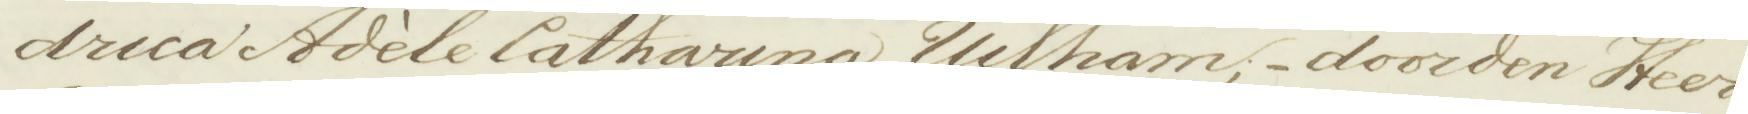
drica Adèle Catharina Uilham; - door den Heer
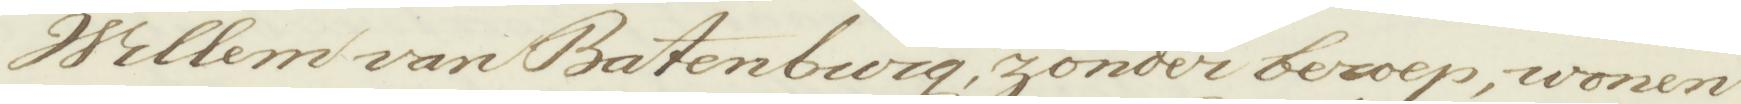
Willem van Batenburg, zonder beroep, wonen,
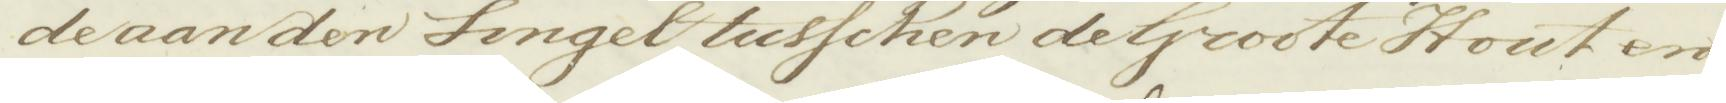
de aan den Singel tusschen de Groote Hout en
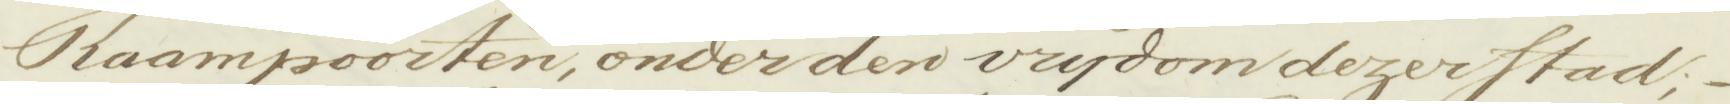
Raampoorten, onder den vrydom dezer stad; -
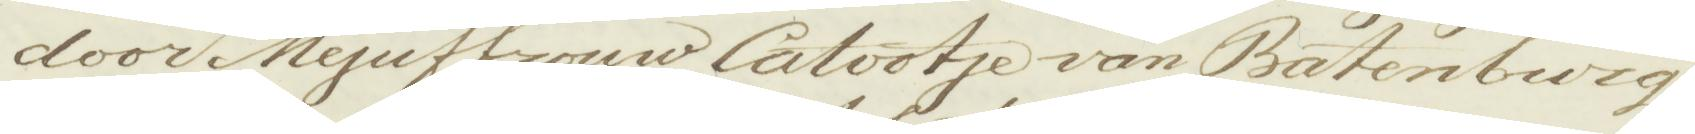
door Mejuffrouw Catootje van Batenburg,
